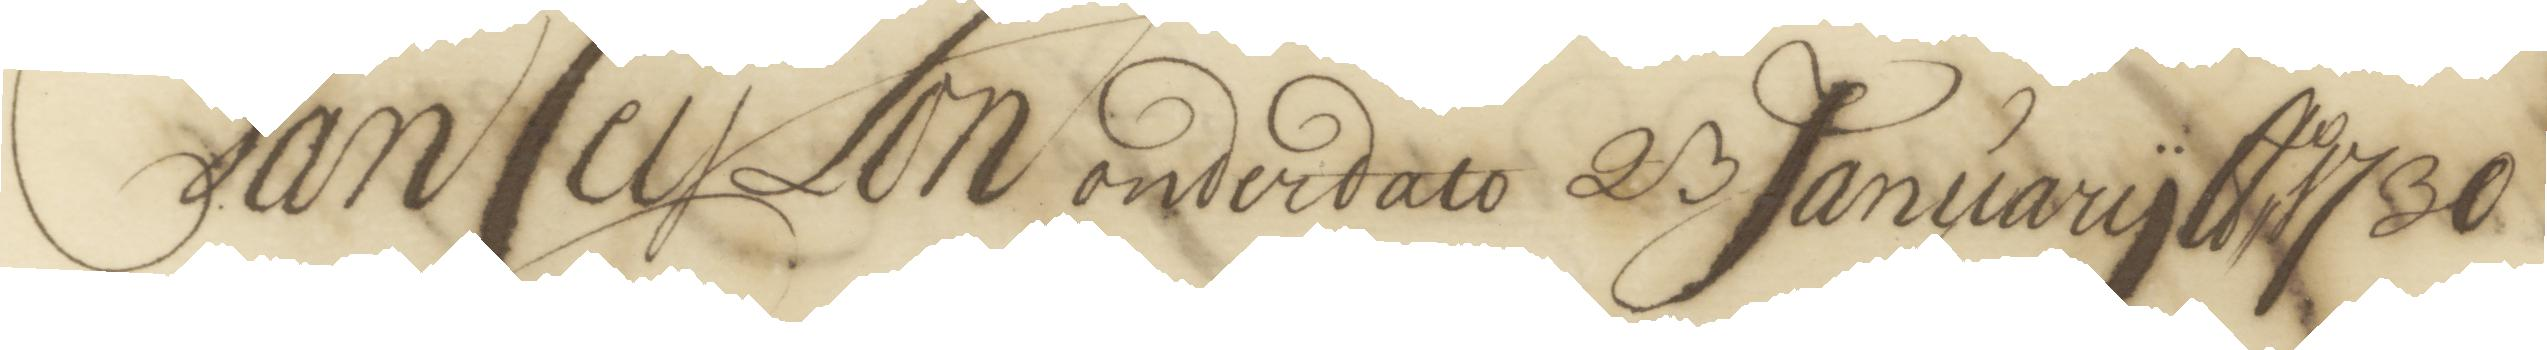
Van Ceijlon onder dato 23 Januarij A„o 1730
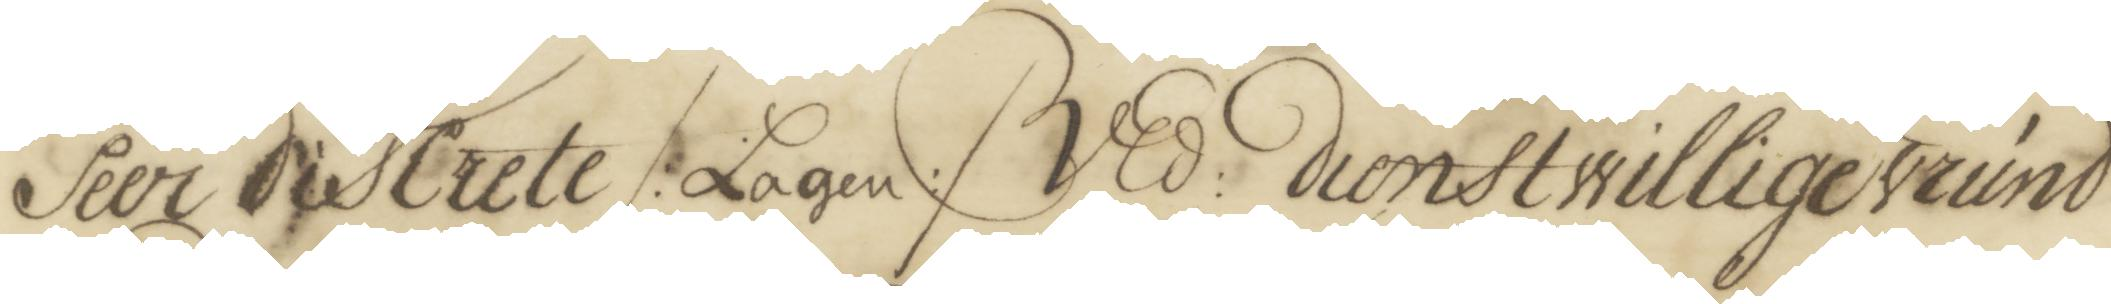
Seer discrete /:Lager:/ VEd: dienstwillige vrund
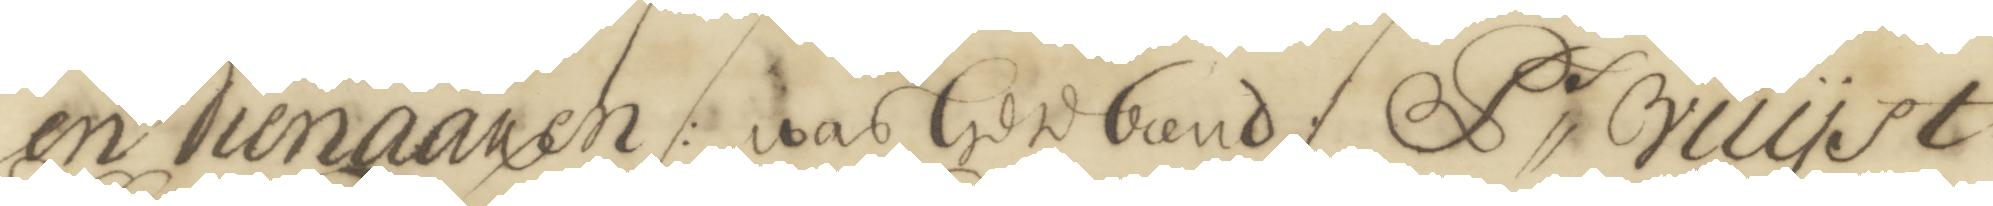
en dienaaren /:was getekend:/ P„s vuijst
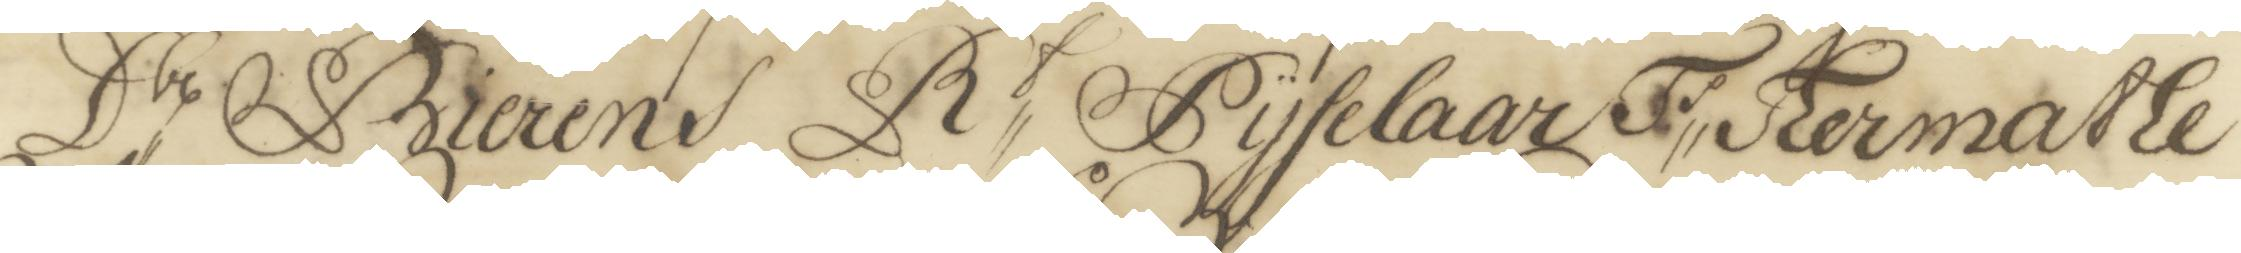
D„k Bierens R„f Pijselaar T„s Thermathe
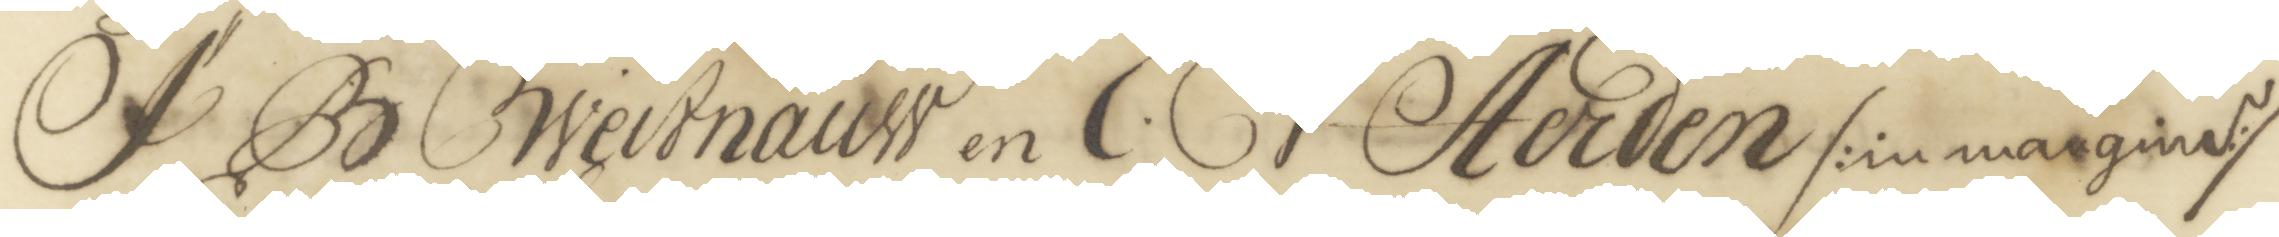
J B Weitnauw en C. v. Aerden /:in margine:/
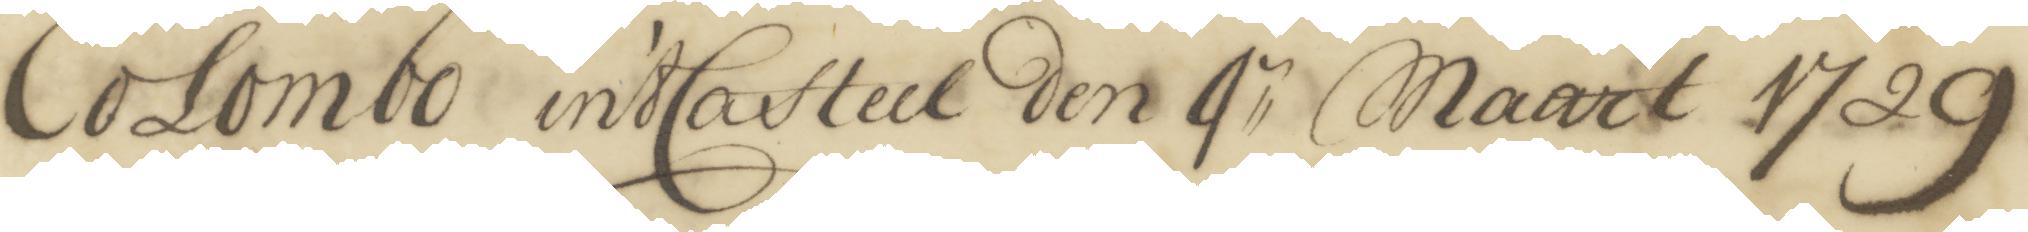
Colombo in't Casteel den 4„e Maart 1729
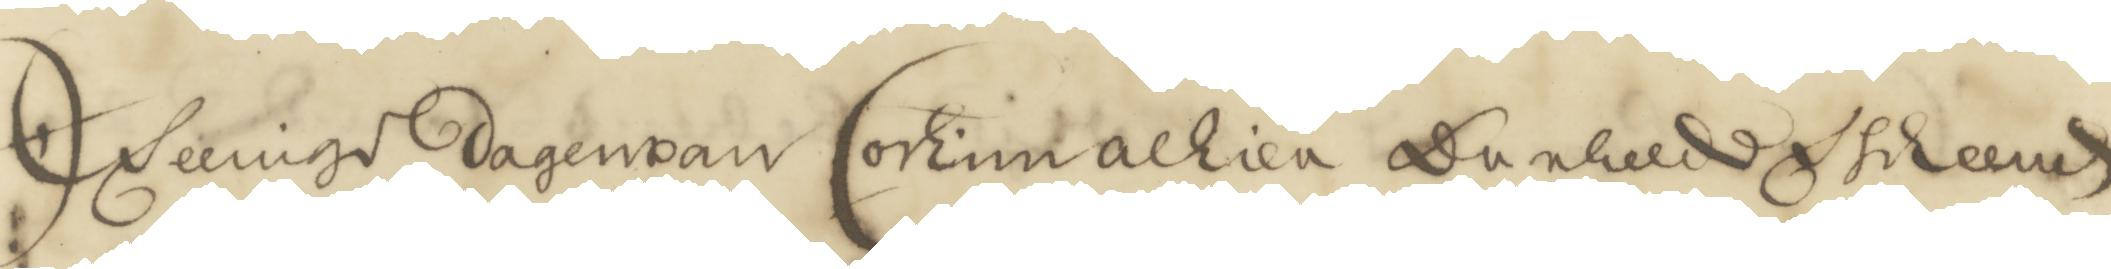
Over eenige dagen van Cochim alhier ter rheede verscheenen
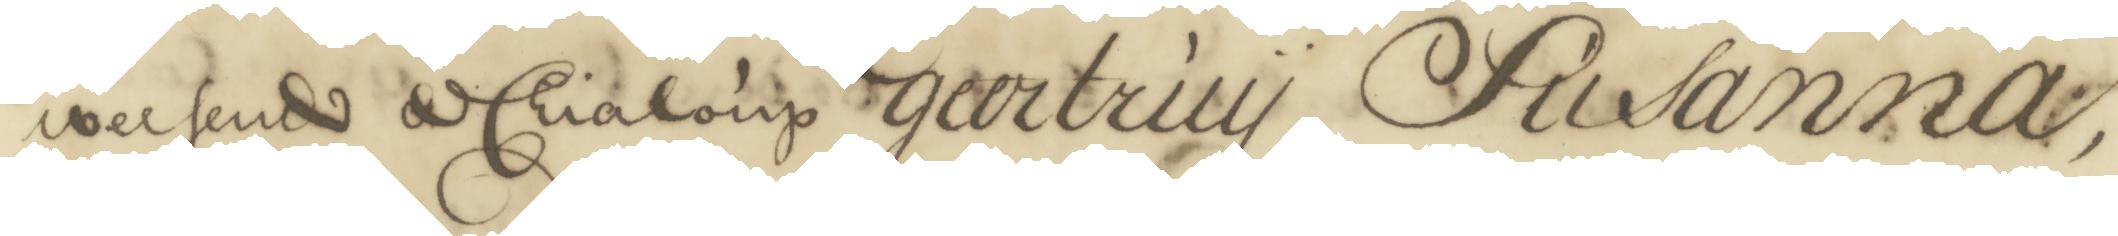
weesende de Chialoup geertruij, Susanna,
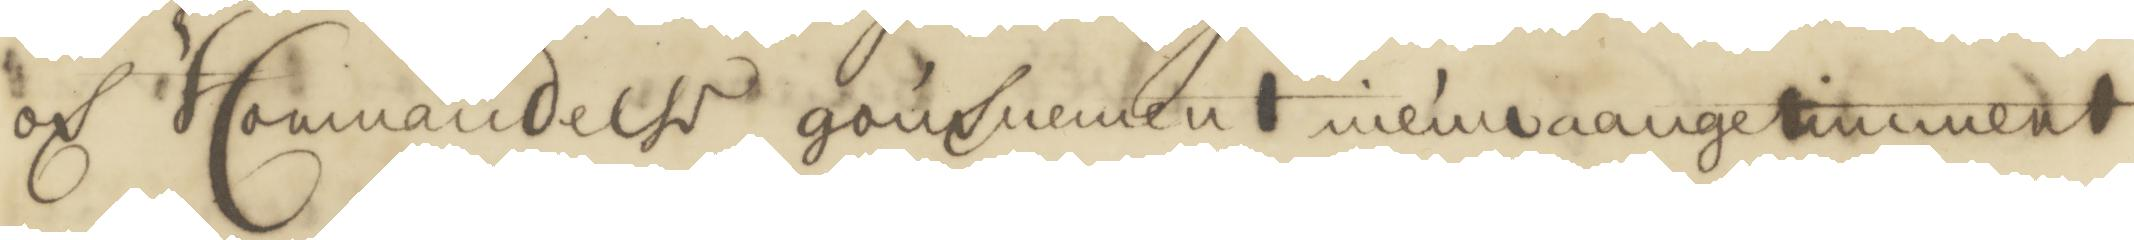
over ’t Cormandelse gouvernement nieuw aangetimmert
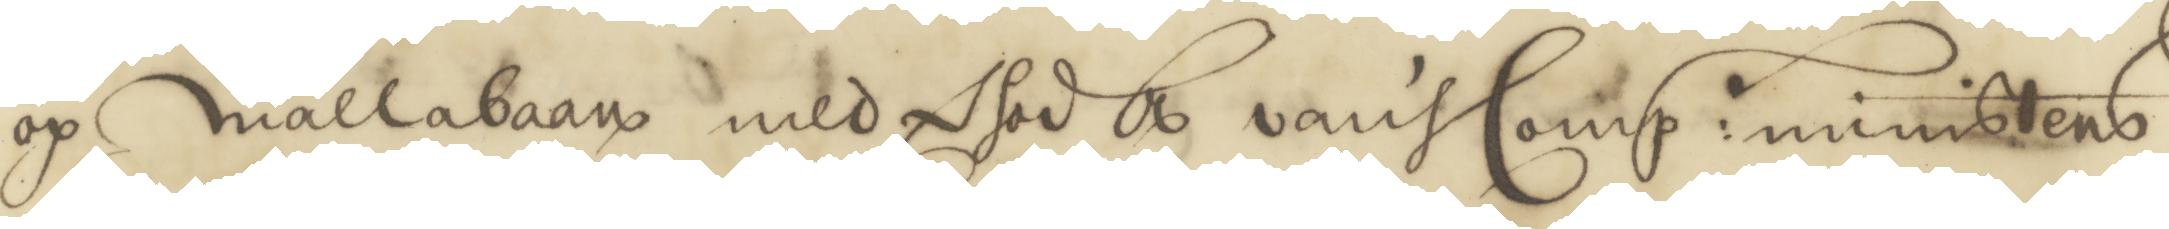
op mallabaar med versoek van ’s Comp:s ministers
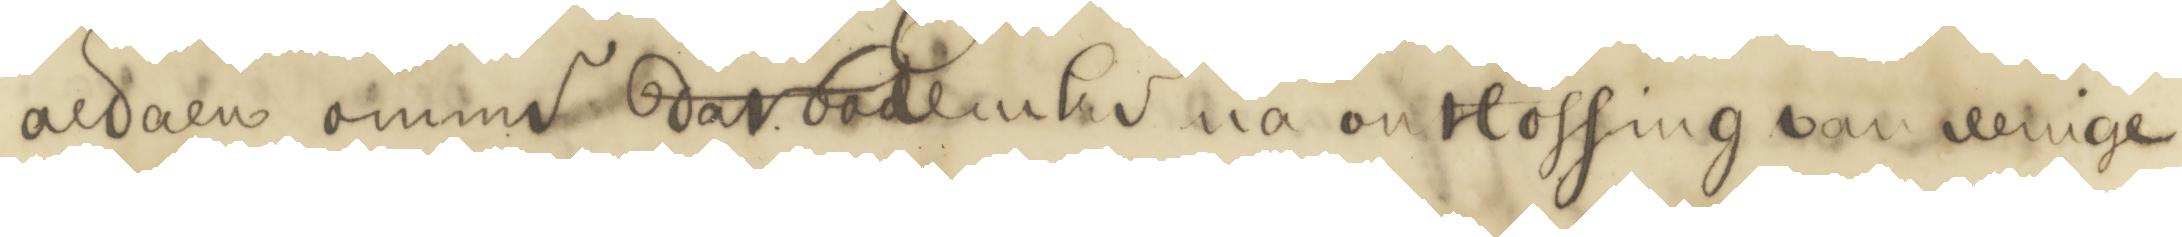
aldaer omme dat bodemke na ontlossing van eenige
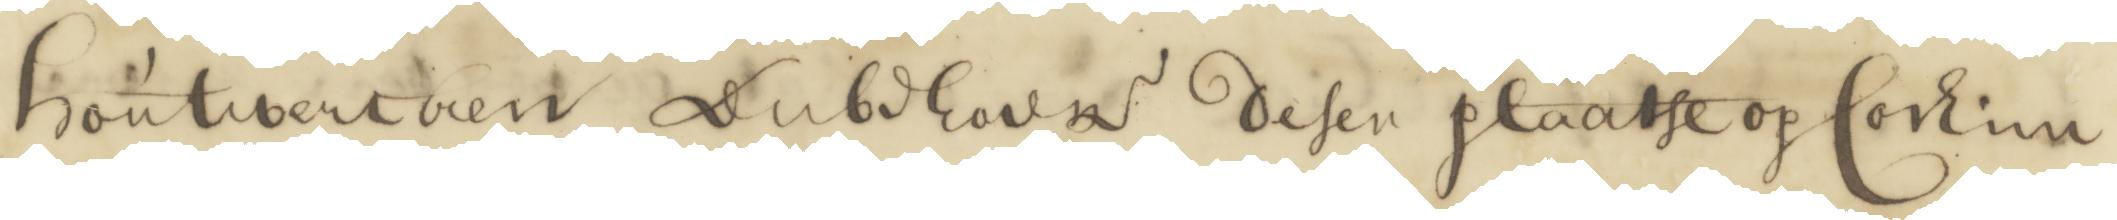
houtwercken ten behoeve deser plaatse op Cochim
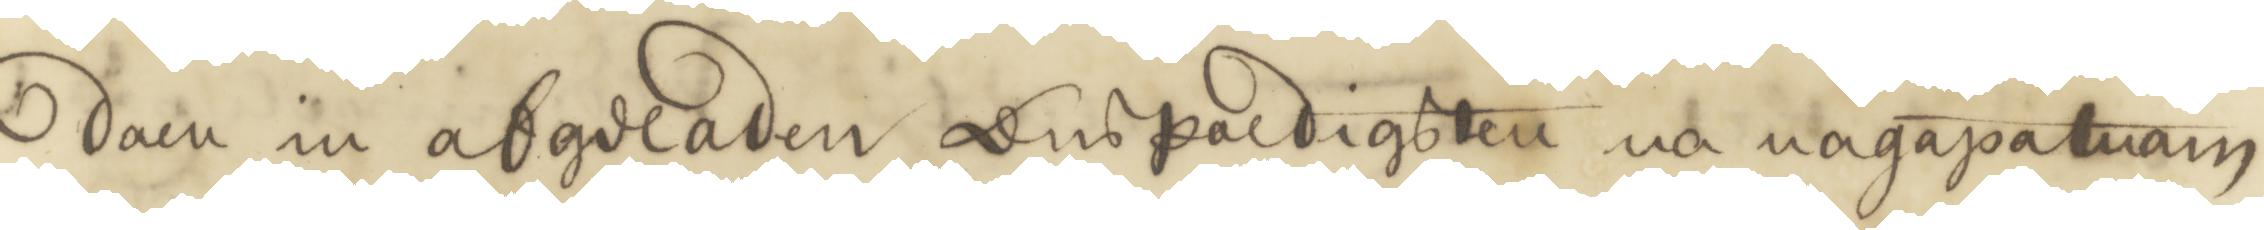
daer in afgeladen tenspoedigsten na nagapatnam
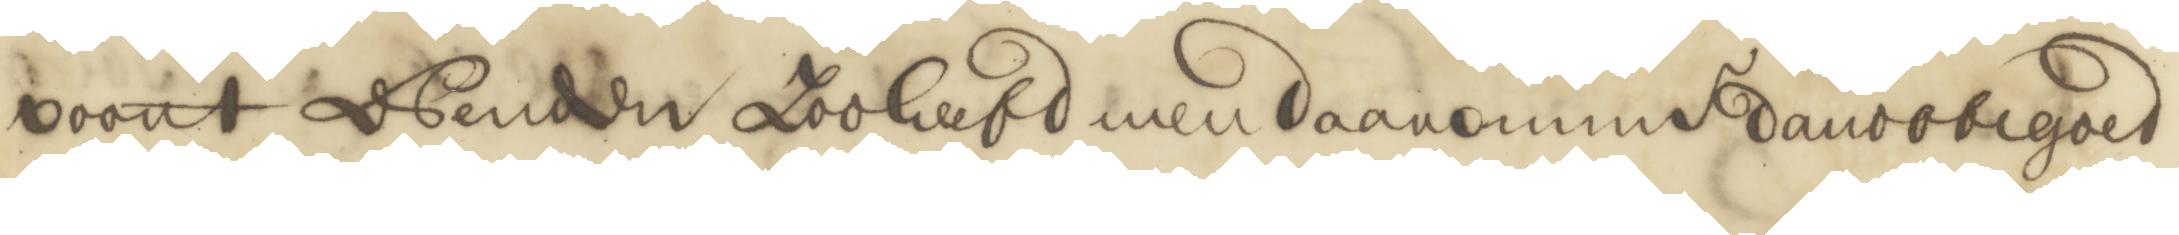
voort tebenden Zoo heefd men daaromme dan ook goed
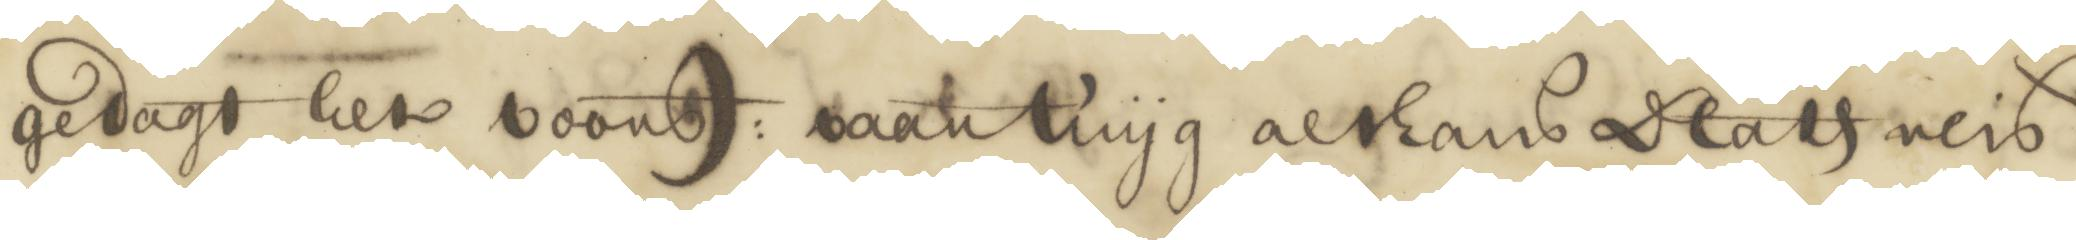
gedagt het voorsz: vaartuijg althans te laten reis
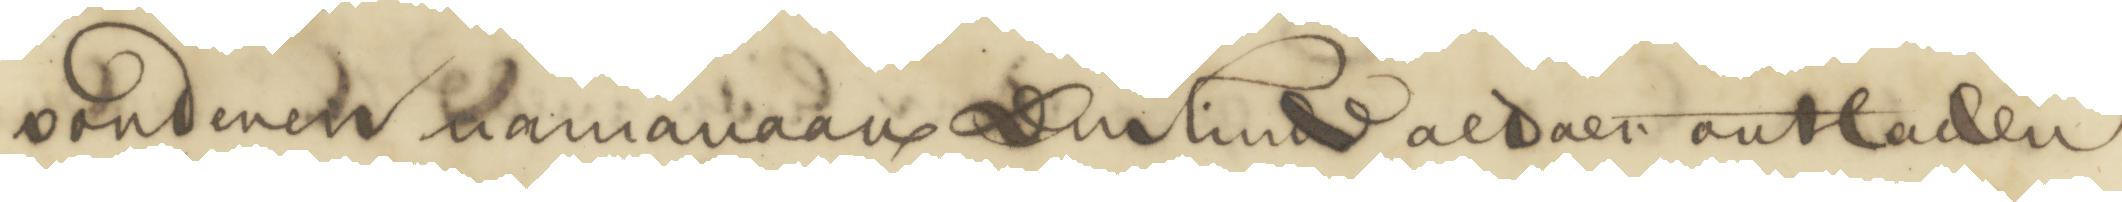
vorderen na manaar ten einde aldaer ontladen
